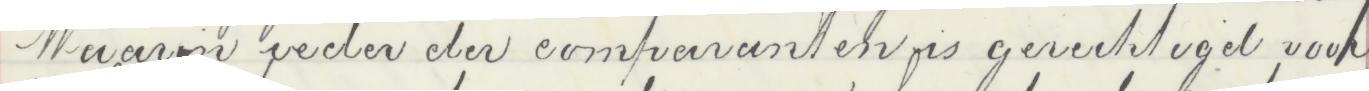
Waarin ieder der comparanten, is gerechtigd voor
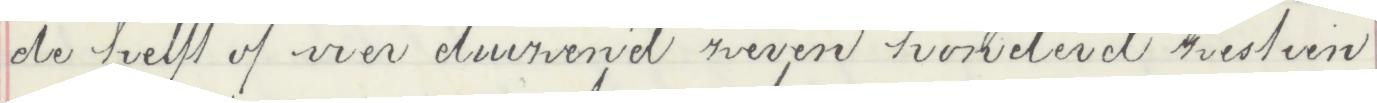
de helft of over duizend zeven honderd zestien
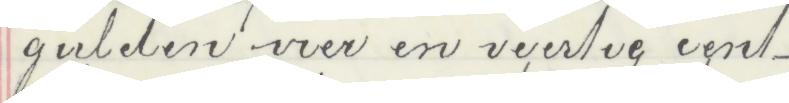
gulden vier en veertig cent
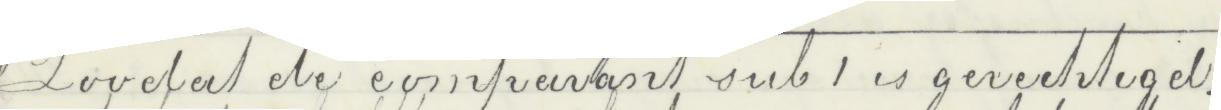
Zoodat de comparant sub 1 is gerechtigd
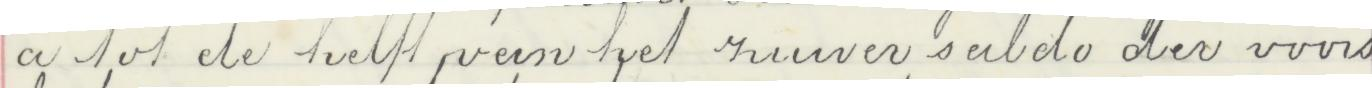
a tot de helft van het zuiver saldo der voorscreven huwe
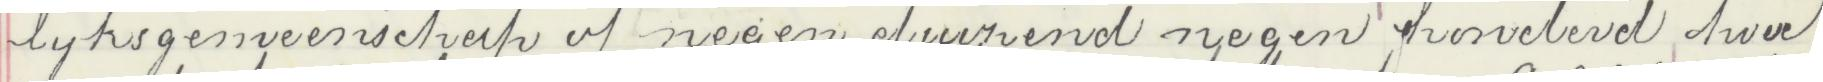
lyks gemeenschap of negen duizend negen honderd twee
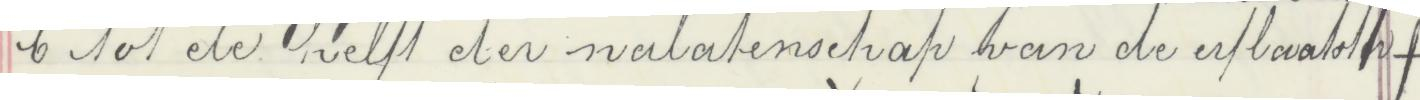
b Tot de helft der nalatenschap van de erflaatster
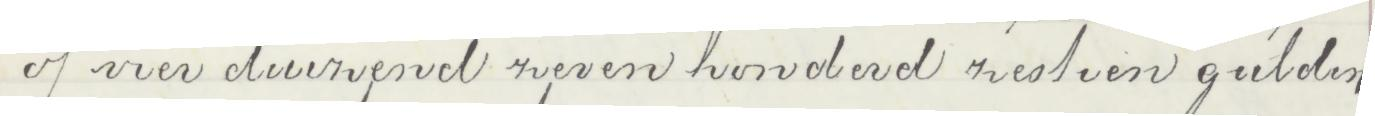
of vier duizend zeven honderd zestien gulden
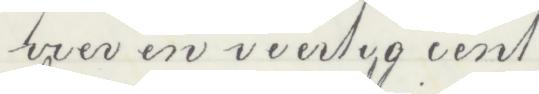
vier en veertig cent
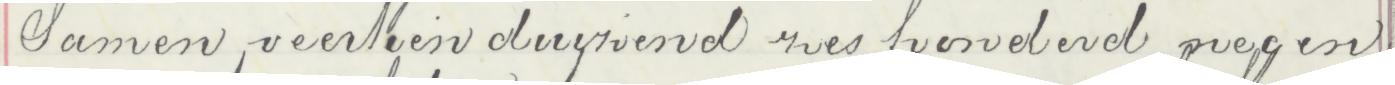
Samen veertien duizend zes honderd negen
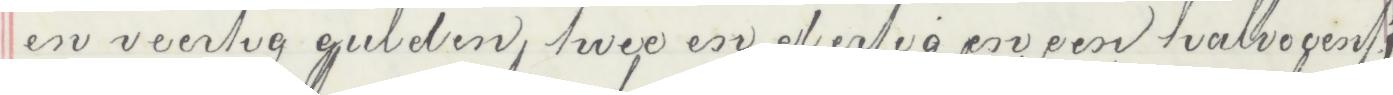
en veertig gulden, twee en dertig en een halve cent
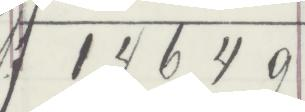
ƒ 14649
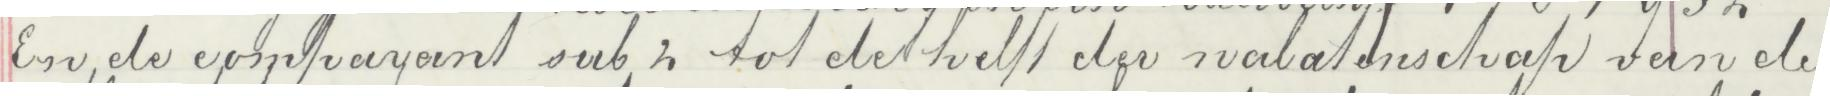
En de comparant sub 2 tot de helft der nalatenschap van de
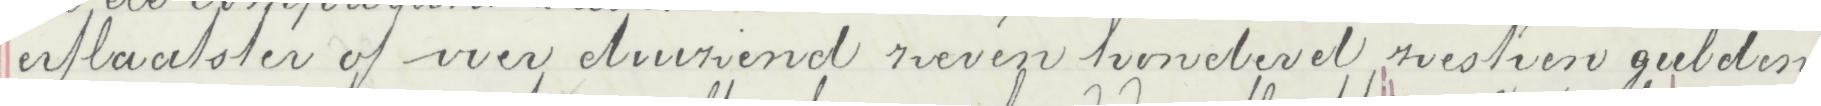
erflaatster of vier duizend zeven honderd zestien gulden
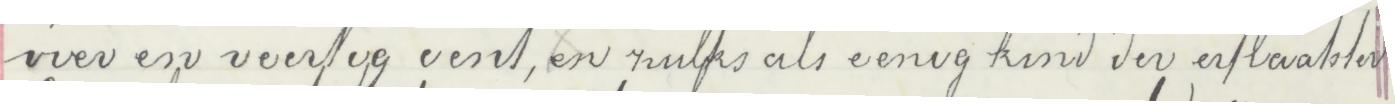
vier en veertig cent, en zulks als eenig kind der erflaatster
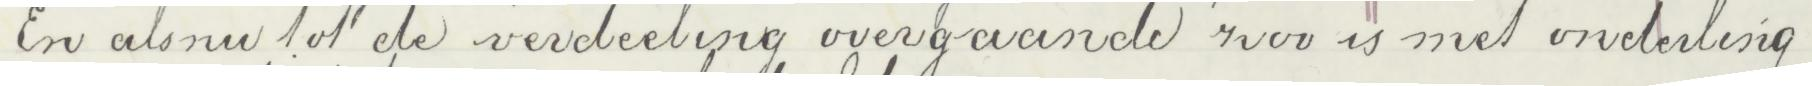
En alsnu tot de verdeeling overgaande zoo is met onderling
